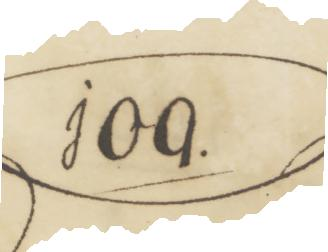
104.
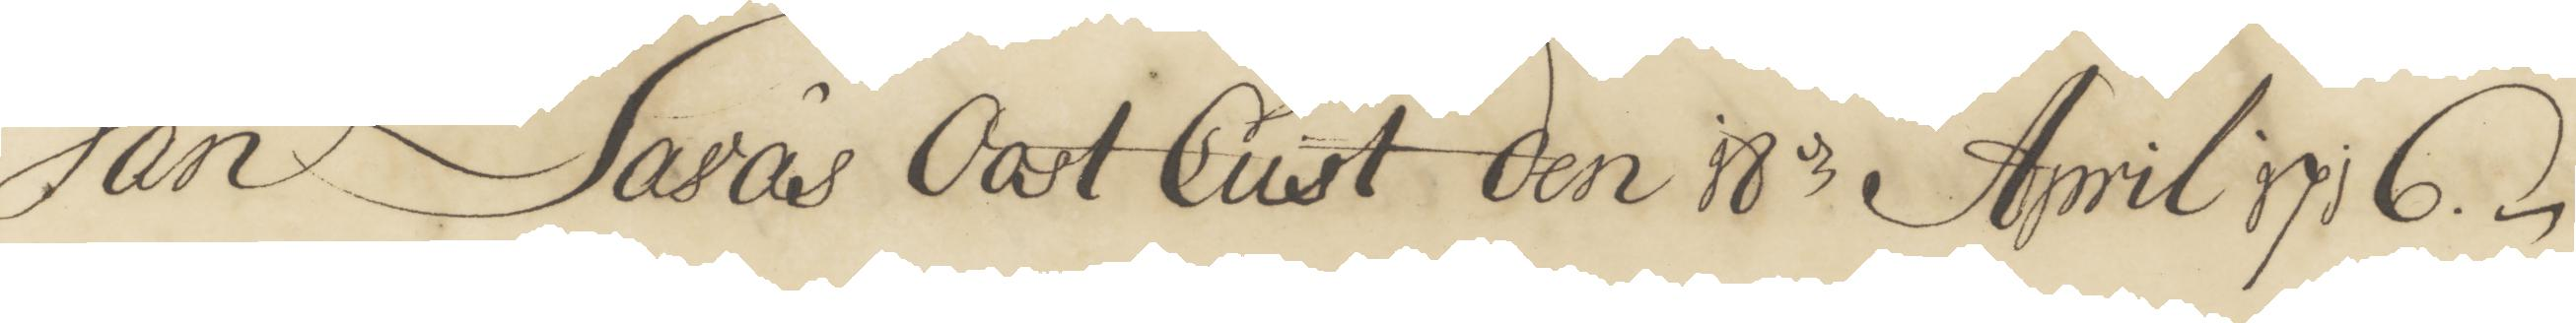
Van Javas Oost Cust den 18en April 1716. —
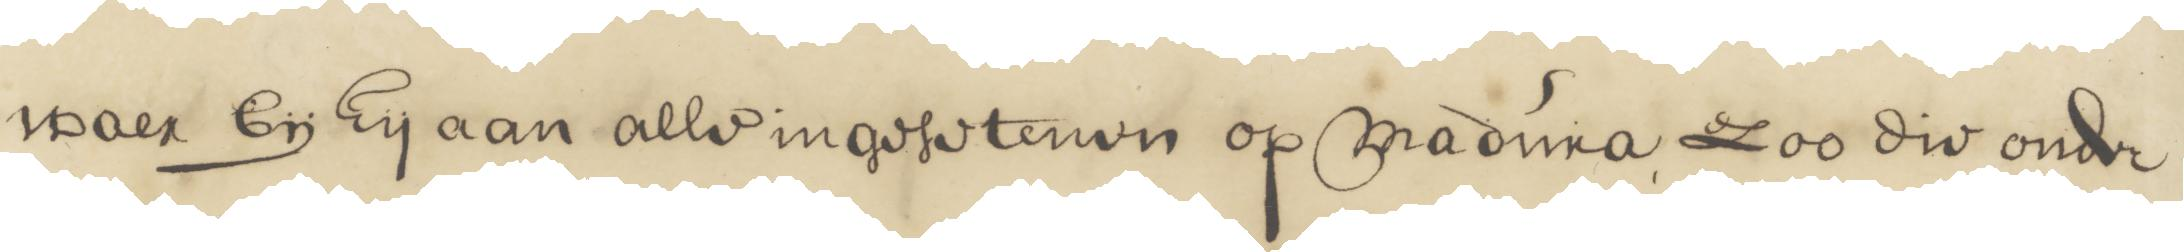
waer bij hij aan alle ingesetenen op madura, zoo die onder
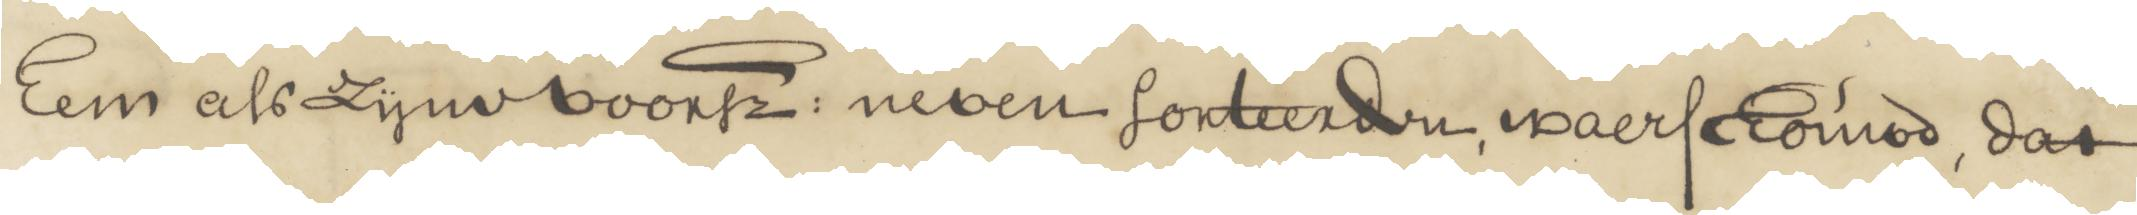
hem als zijne voorsz: neven sorteerden, waerschouwd, dat
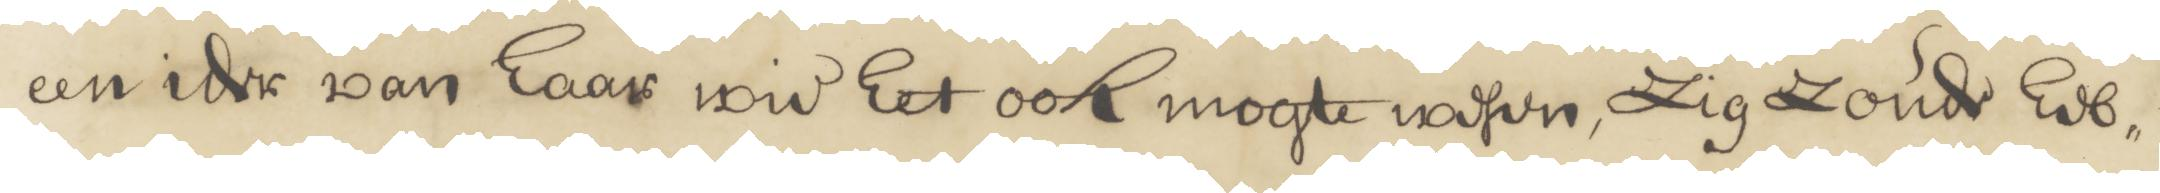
een ider van haar wie het ook mogte wesen, zig zoude heb„
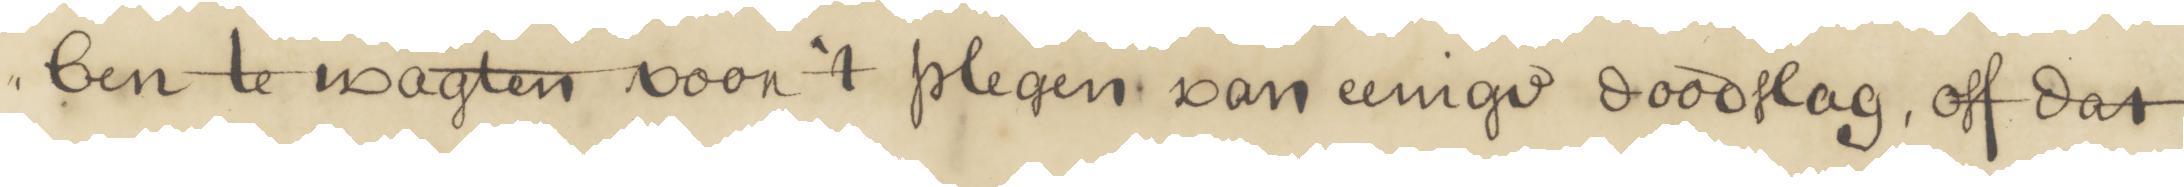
„ben te wagten voor ’t plegen van eenige doodslag, off dat
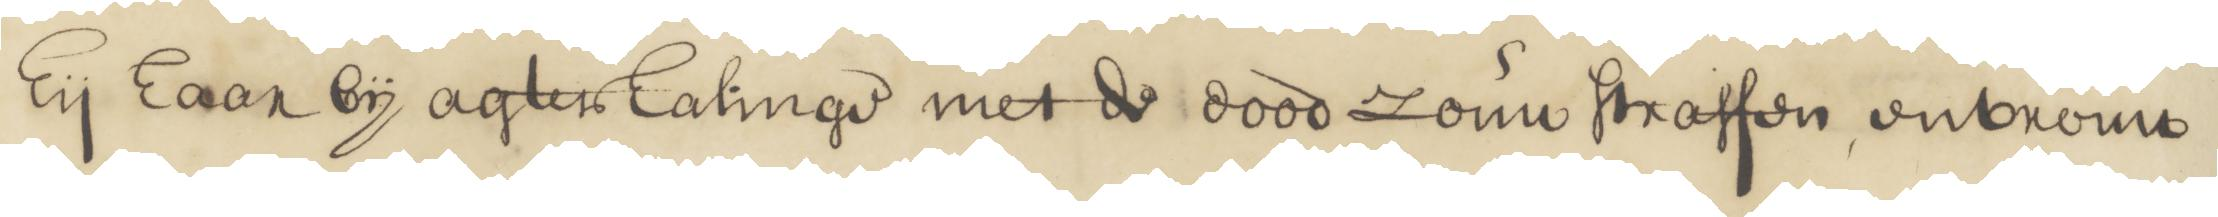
hij haar bij agterhalinge met de dood zouw straffen, en vrouw
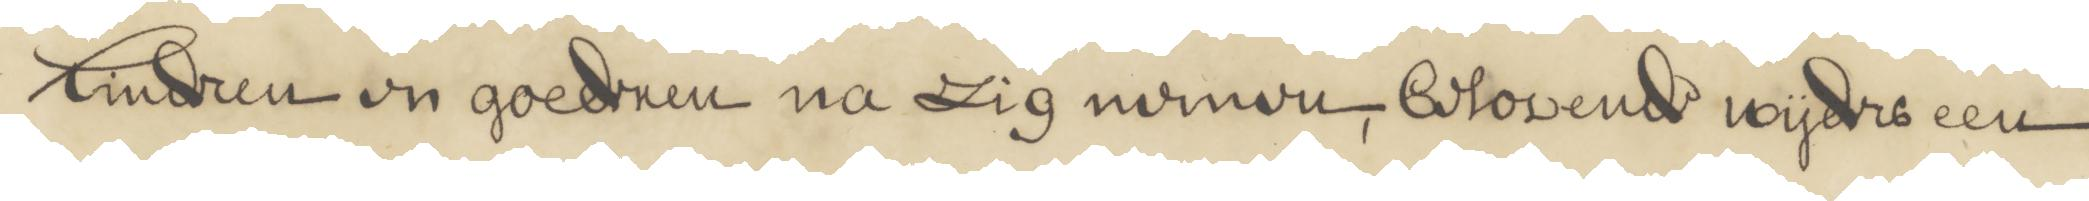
kinderen en goederen na zig nemen, belovende wijders een
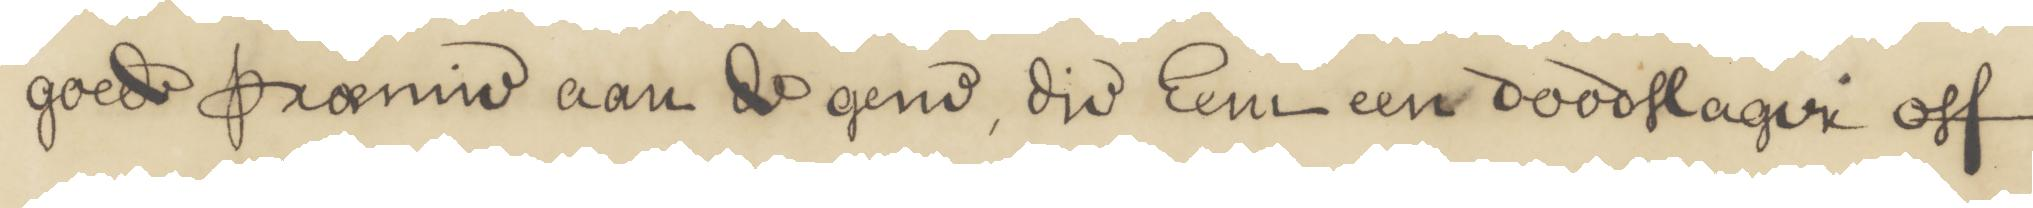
goede praemie aan de gene, die hem een doodslager off
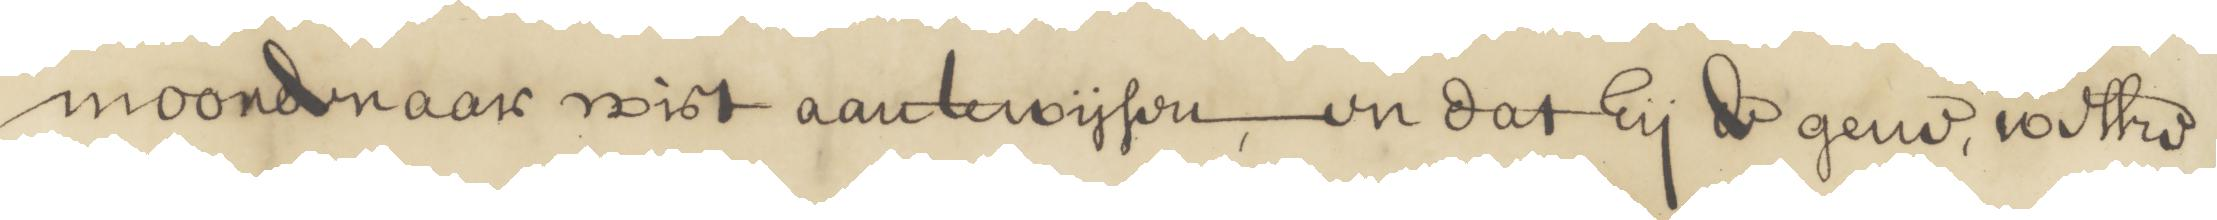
moordenaar wist aantewijsen, en dat hij de gene, welke
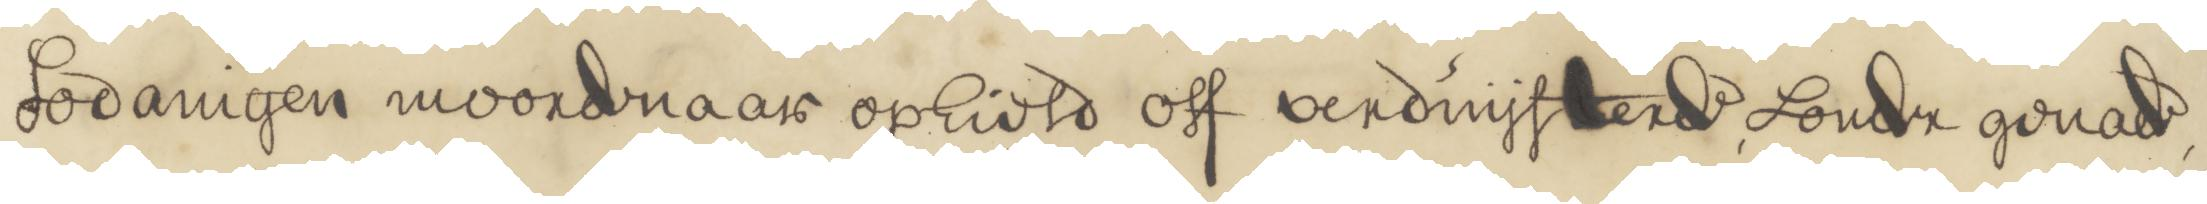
sodanigen moordenaar ophield off verduijsterde, sonder genade,
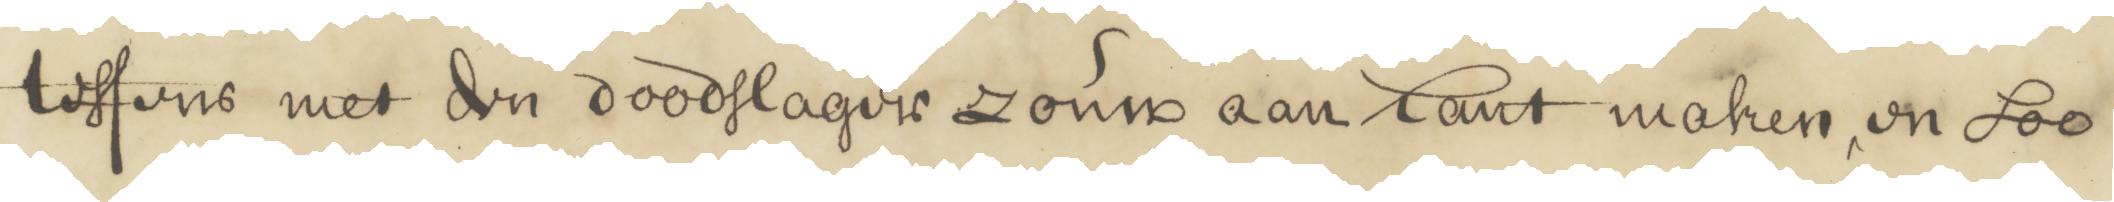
teffens met den doodslager zouw aan kant maken, en soo
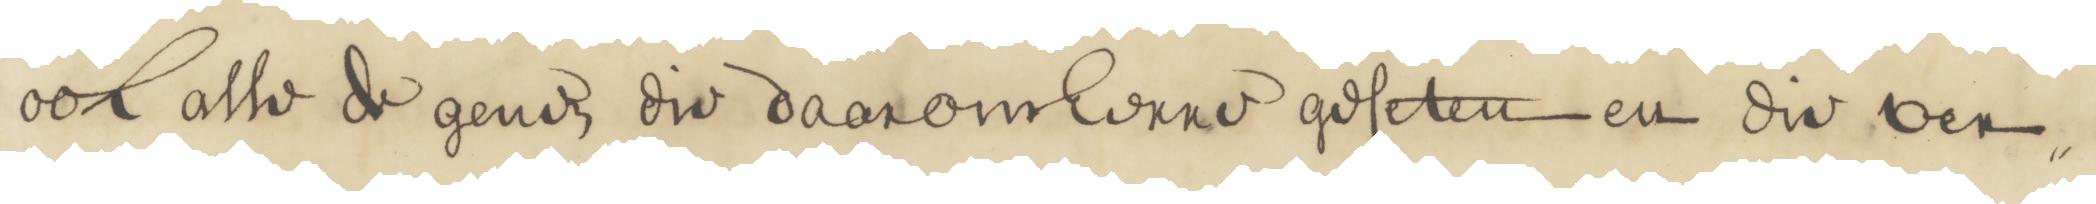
ook alle de genen die daaromherre geseten en die ver„
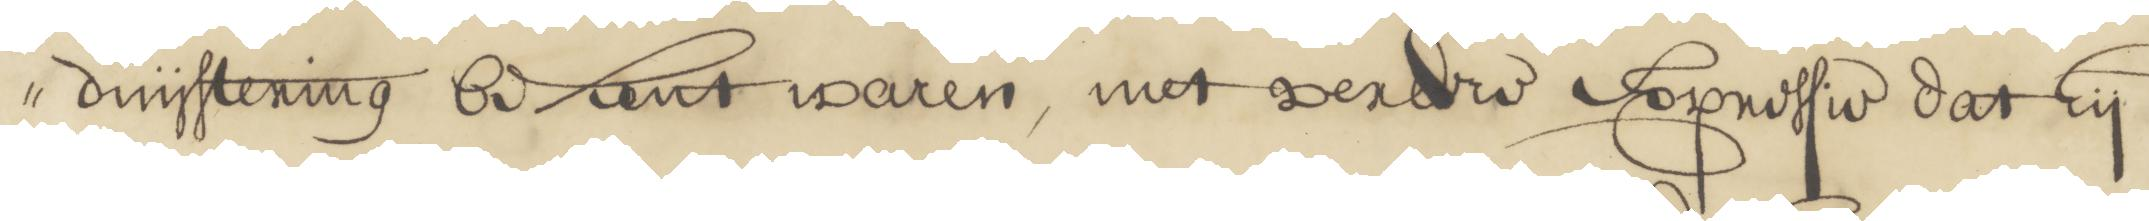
„duijstering bekent waren, met verdere Expressie dat hij
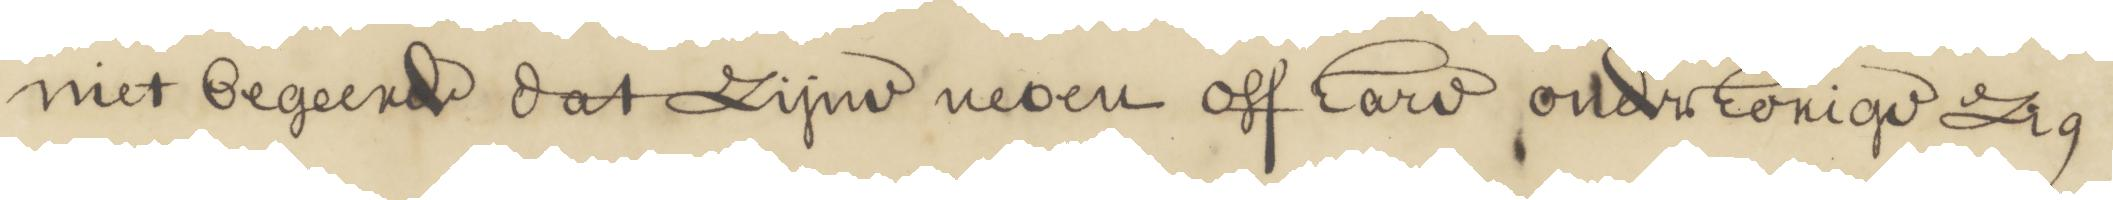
niet begeerde dat zijne neven off hare onderhorige zig
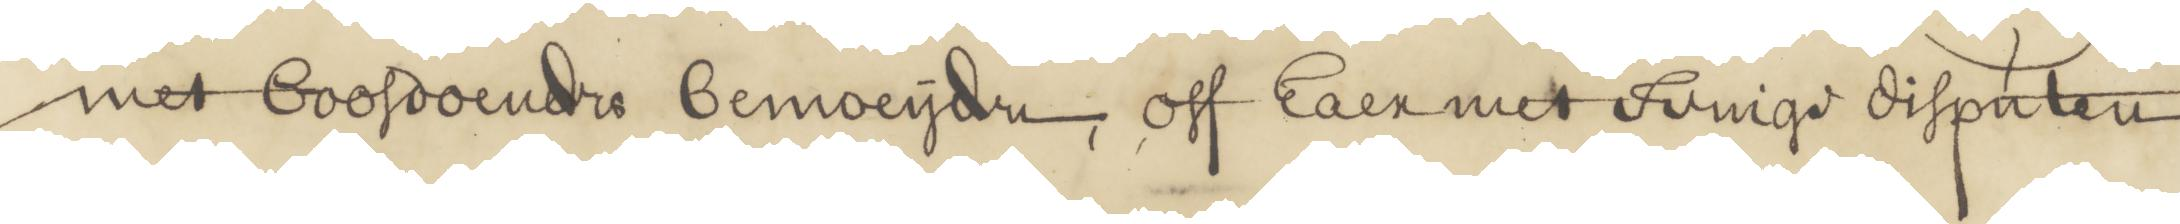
met boosdoenders bemoeijden, off haer met Eenige disputen
